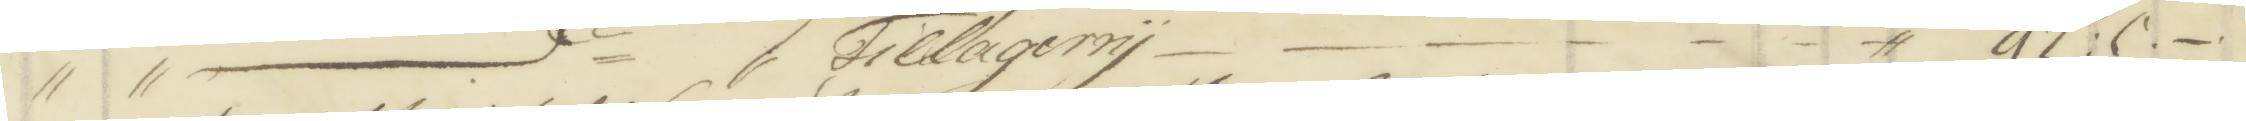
„ „ —' „ Tillagernij - - - - - - „ 47:5.—.
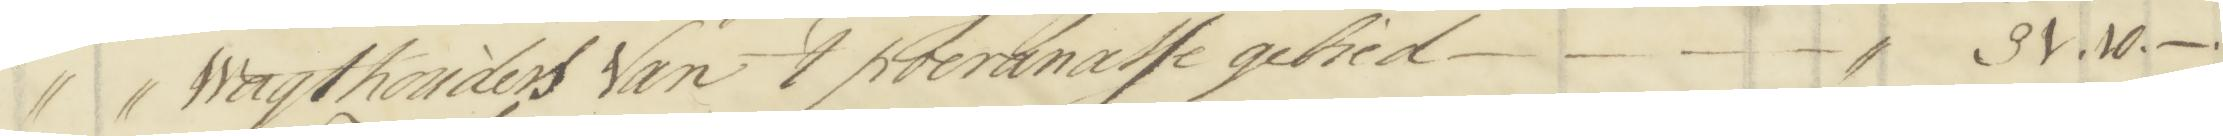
„ „ wagthouders van ’t poeranasse gebied - - - - „ 31.10.—.
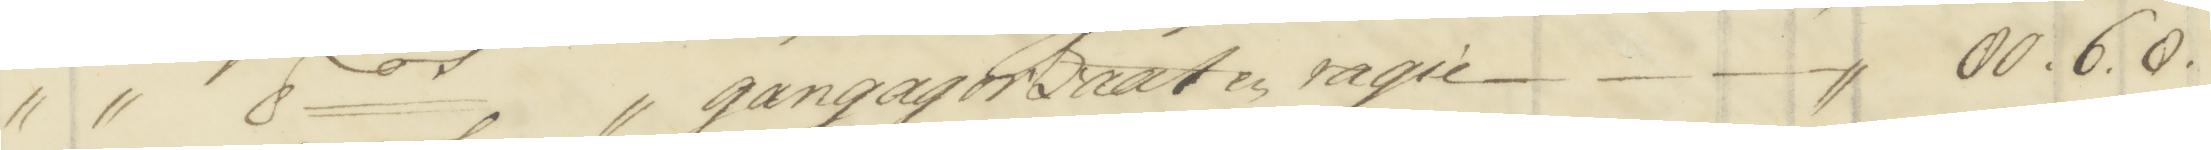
„ „ d=os „ gangagorzaat en ragie „ 80:6.8.
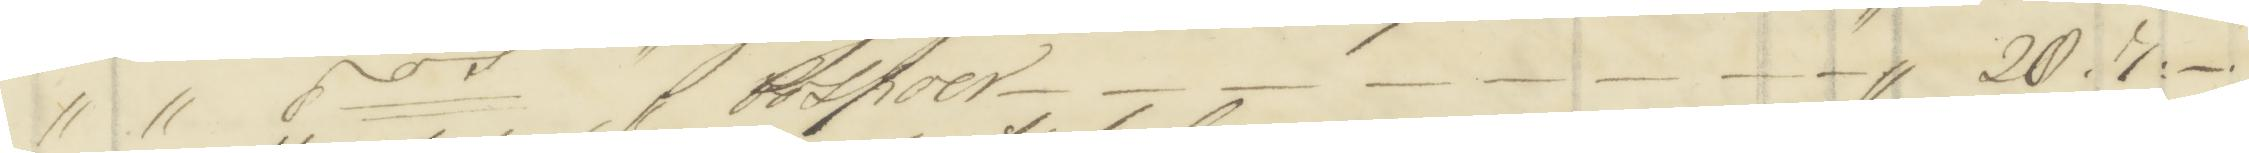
„ „ d=os „ bospoer - - - - - - - - - „ 28.7:—.
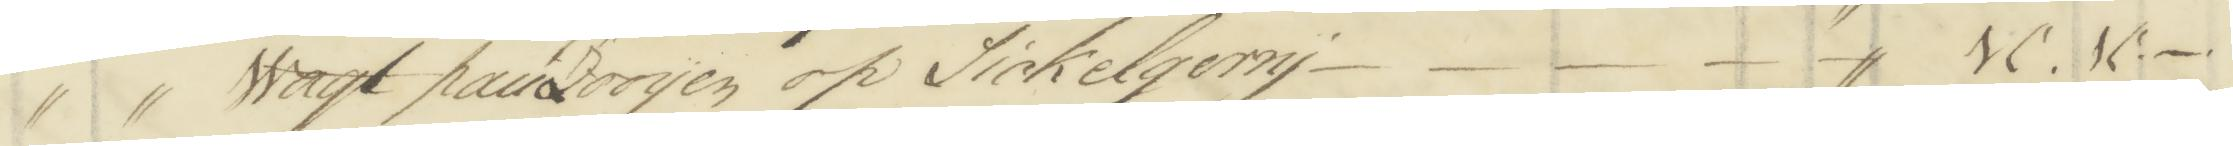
„ „ wagt pauzooijen op Sickelgerij - - - - -„ 15.15:—.
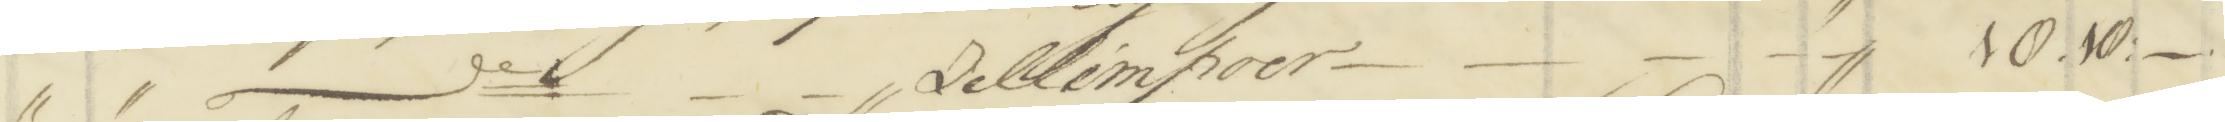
„ „ —'- - - „ zellimpoer - - - - - „ 18.18:—.
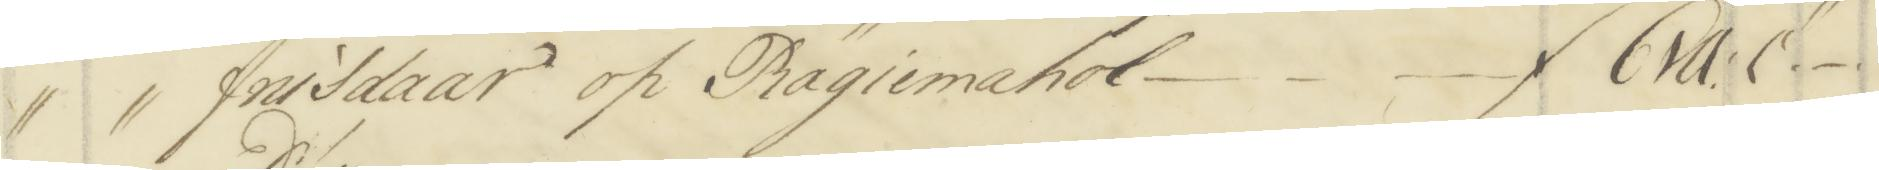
„ „ fausdaar op Ragiemahol - - - - - ƒ 614:5.—.
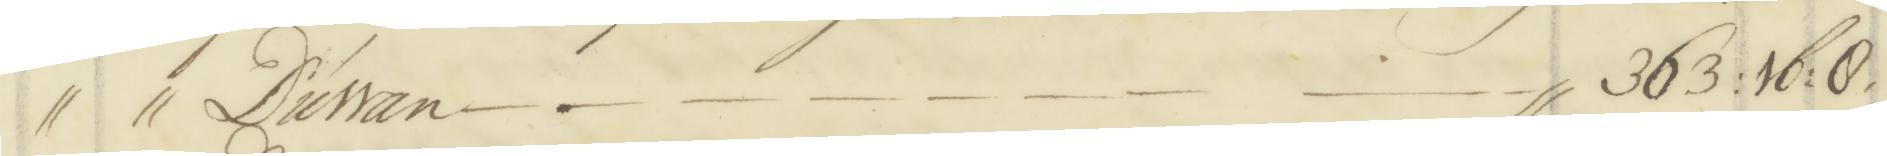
„ „ Duwan - - - - - - - - - - „ 363:16:8.
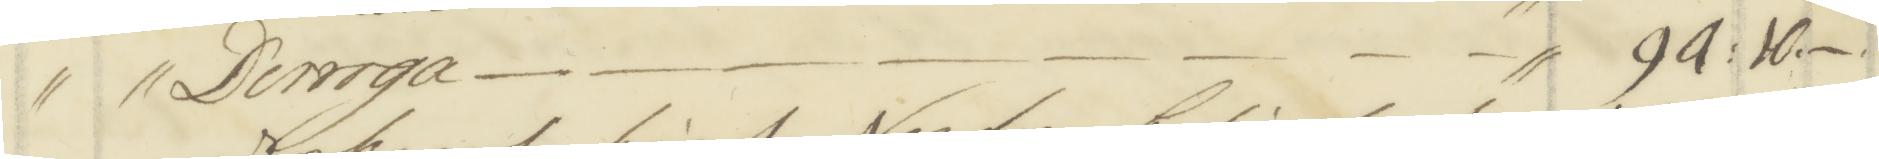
„ „ Derroga - - - - - - - - - „ 94:10.—.
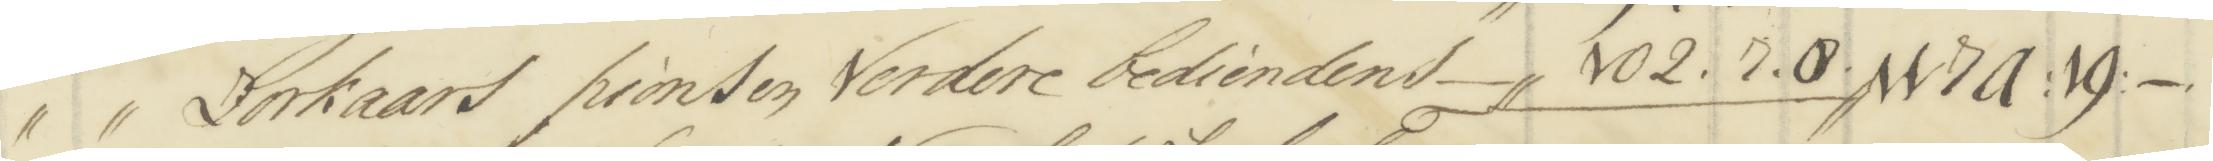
„ „ Zorkaars prinsen Verdere bediendens - - „ 102.7.8. „1174:19:—.
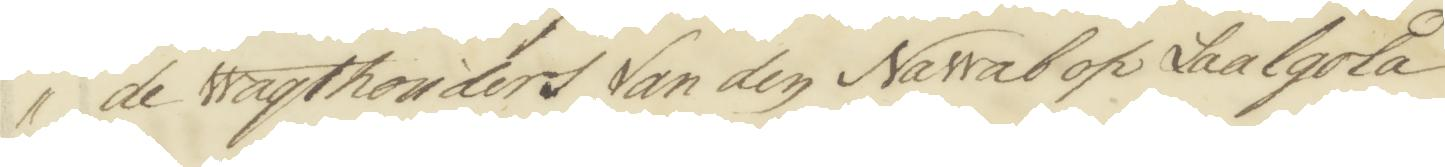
„ de wagthouders Van den Nawab op Saalgola
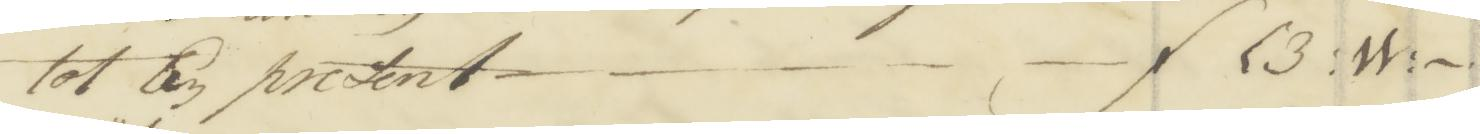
tot Een present - - - - - -ƒ 53:11:—.
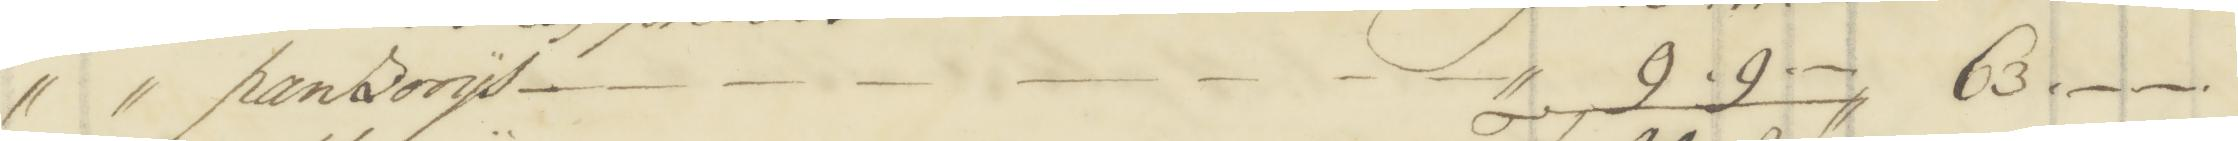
„ „ panzooijs - - - - - - - - „ 9.9.— „ 63.— —.
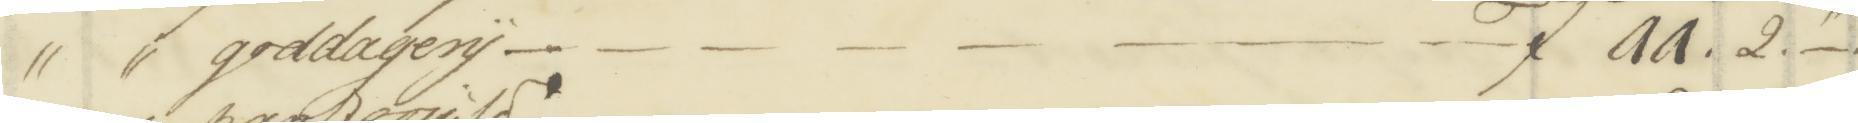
„ „ goddagerij - - - - - - - - -ƒ 44.2.—.
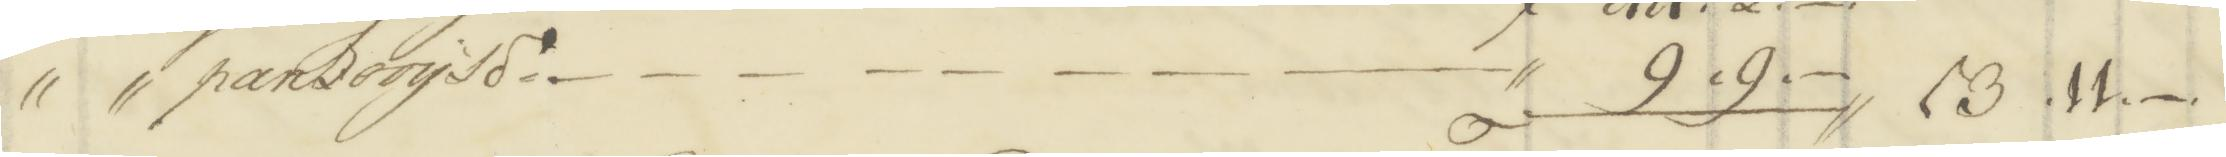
„ „ panzooijs d'- - - - - - - - - d=o „ 9.9.— „ 53.11.—.
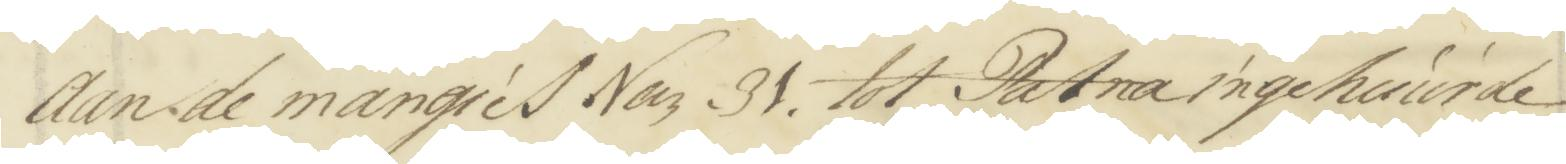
Aan de mangies Van 31. tot Patna ingehuurde
